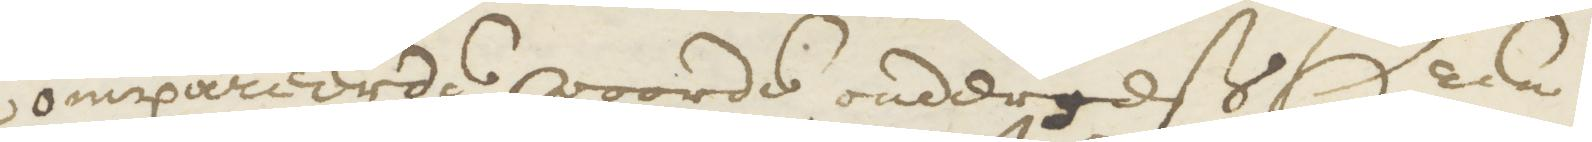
Compareerde voorde ondergesc h.ren
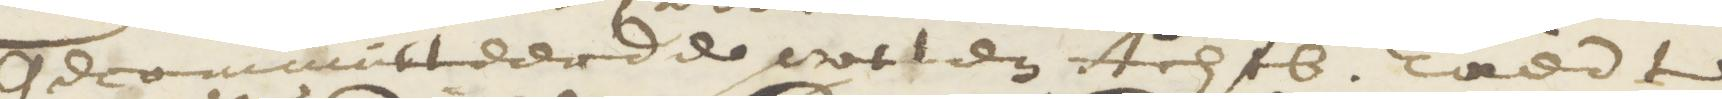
gecommitteerde wtten Achtb. raedt
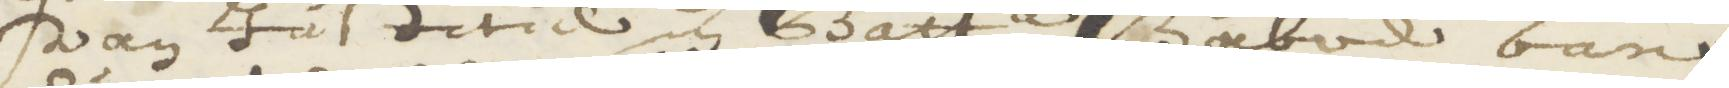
van Iustitie in Batt-a Baboe van
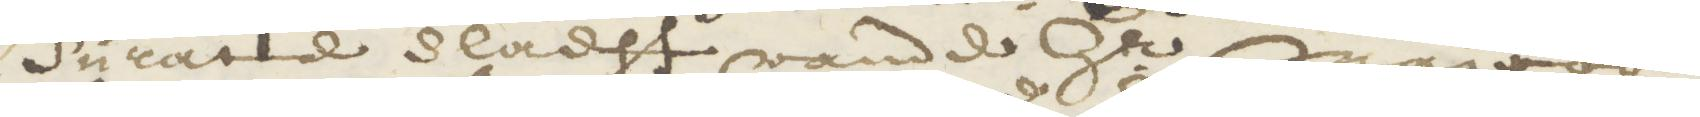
suratte slaeff van de h-r maioor
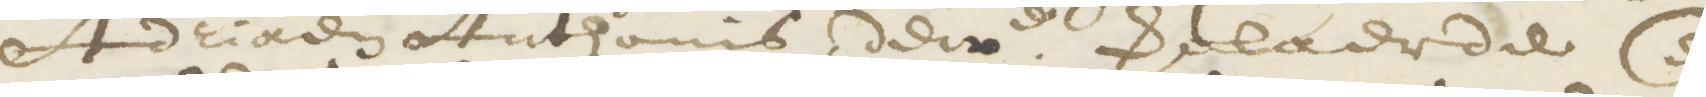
Adriaen Anthonis, den.e verclaerde ende
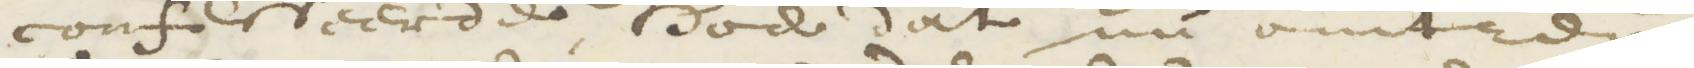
conferreerde, hoe dat nu omtrent
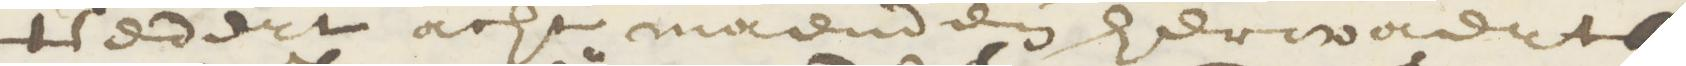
tsedert acht maenden herwaerts
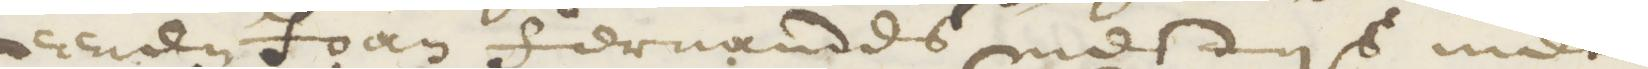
eenen Ioan fernandes mestys met
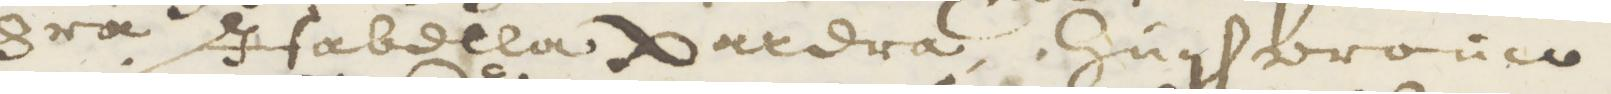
s.ra Isabella parera, huysvrouw
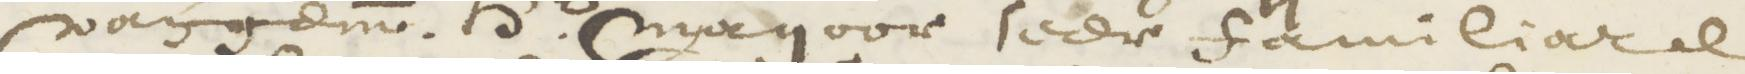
van gem. h.r mayoor seer familiare
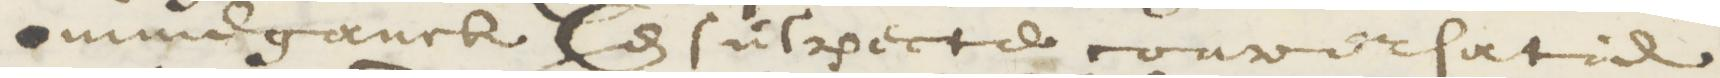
ommeganck ende suspecte conversatie
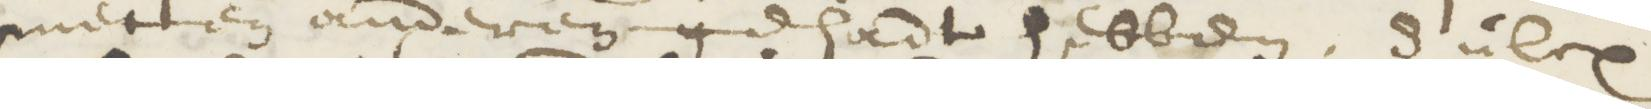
metten anderen gehadt hebben, sulx
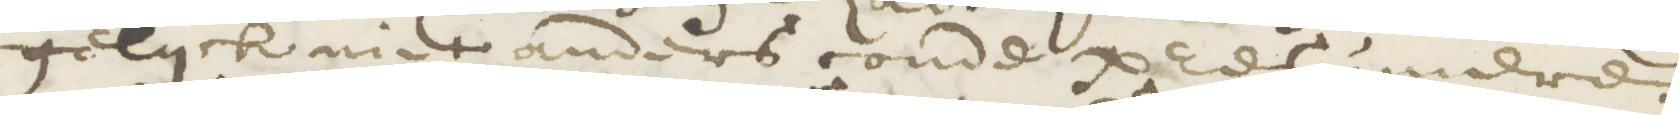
gelyck niet anders conde presumeren
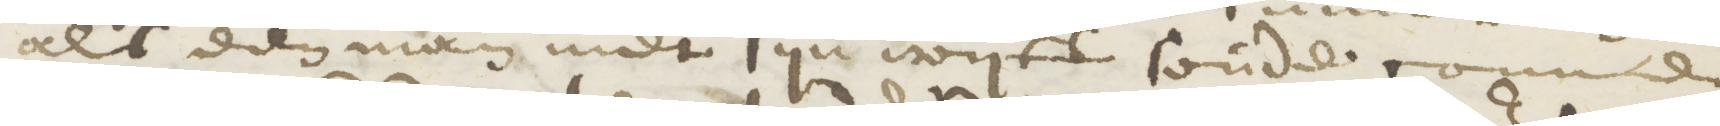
alls een man met syn wyff soude connen
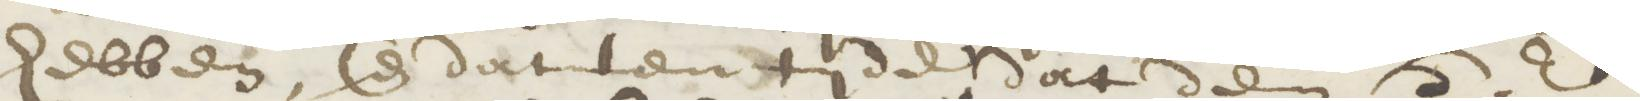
hebben, ende dat ten tyde dat den h.r
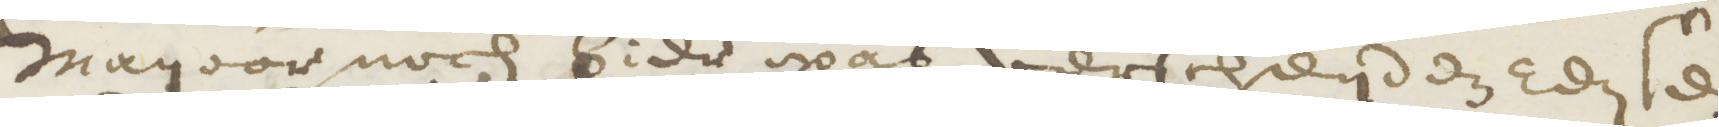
mayoor noch hier was, verscheyden reysen
